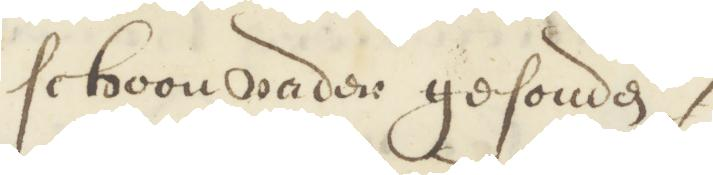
schoonvader gesonden/
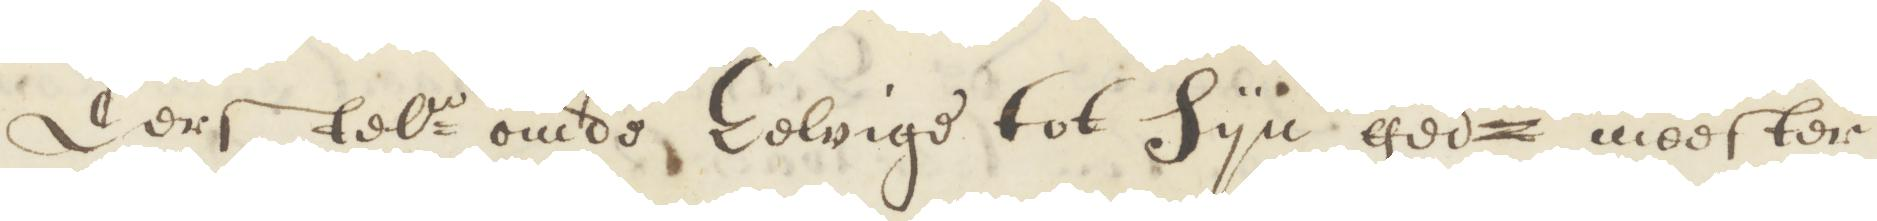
Eerstel=r omde zelvige tot Sijn ged=ens meester
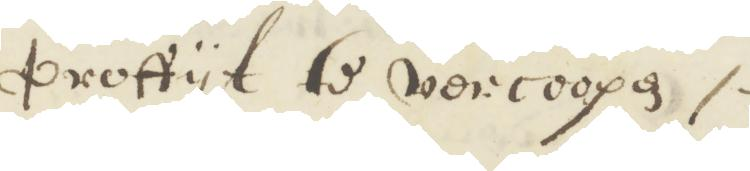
proffijt te vercoopen /
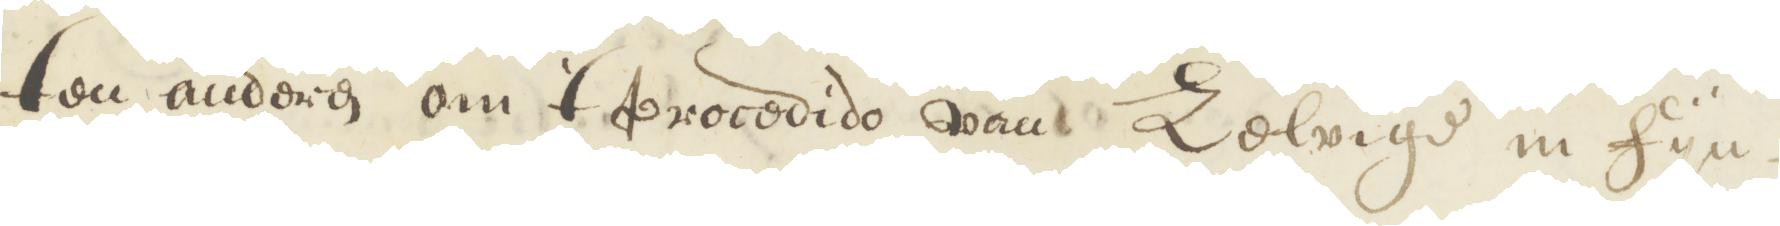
ten anderen om ’t procedido van Zelvige in fijn
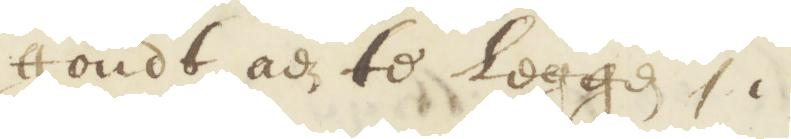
goudt aen te leggen /.
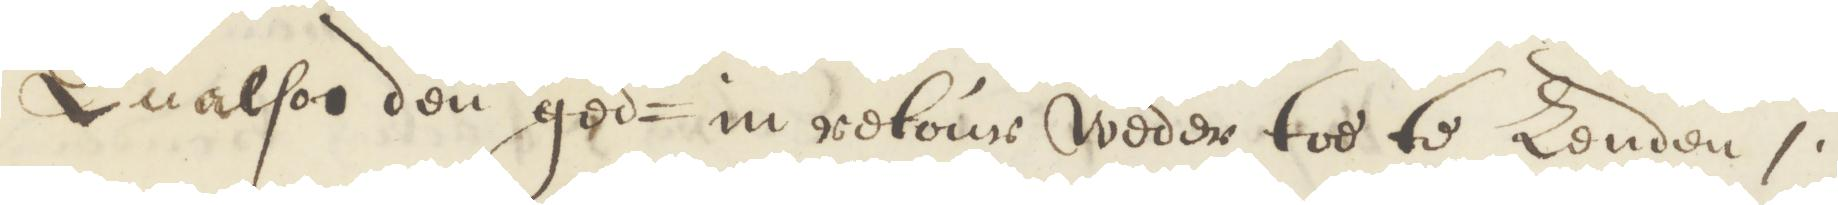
En alsoo den ged=e in retour weder toe te zenden /.
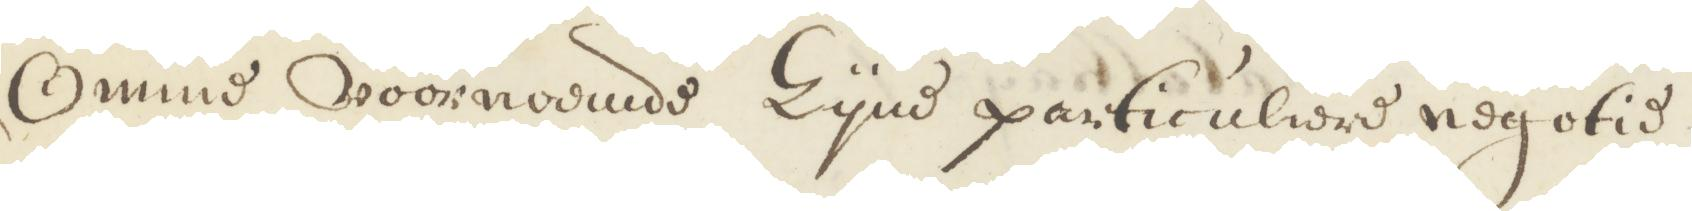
Omme voornoemde zijne particuliere negotie
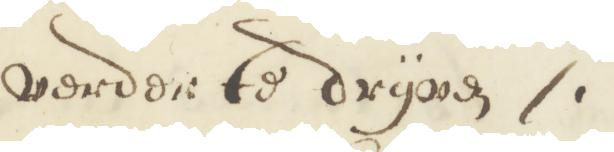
verder te drijven /.
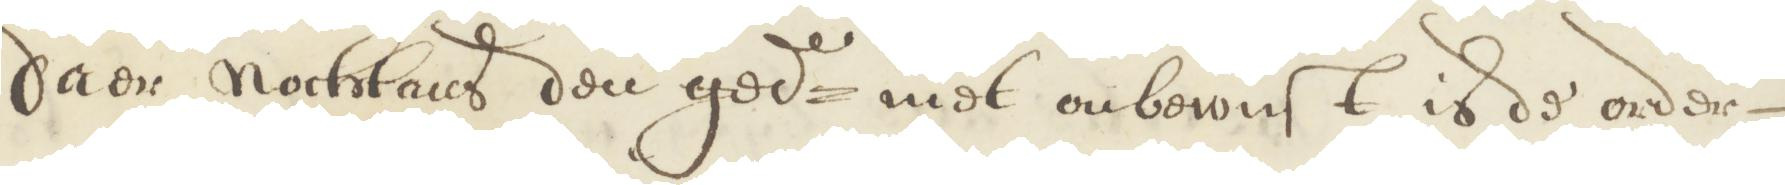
daer nochtans den ged=e niet onbewust is de order
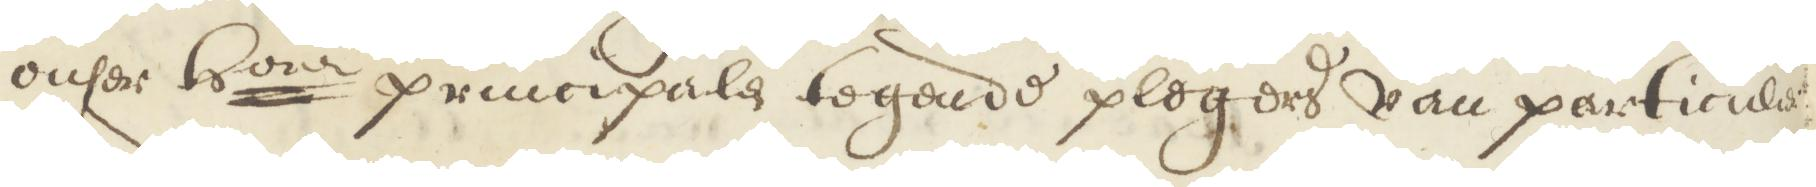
onser H=eren principalen tegen de plegers van particulie
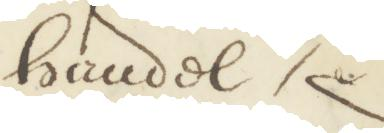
handel /
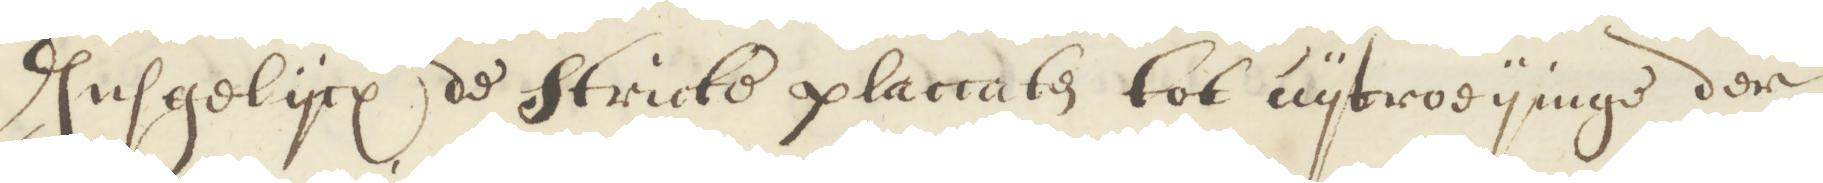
Insgelijcx de stricte placcaten tot uijtroeijinge der
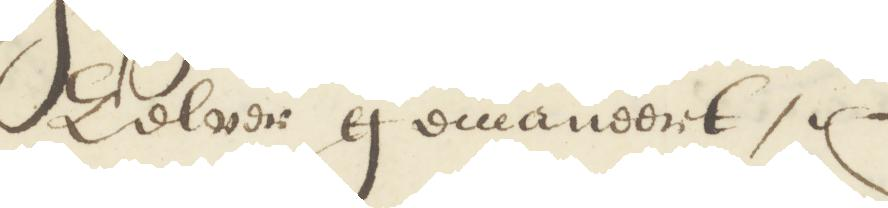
zelver g'emaneert /
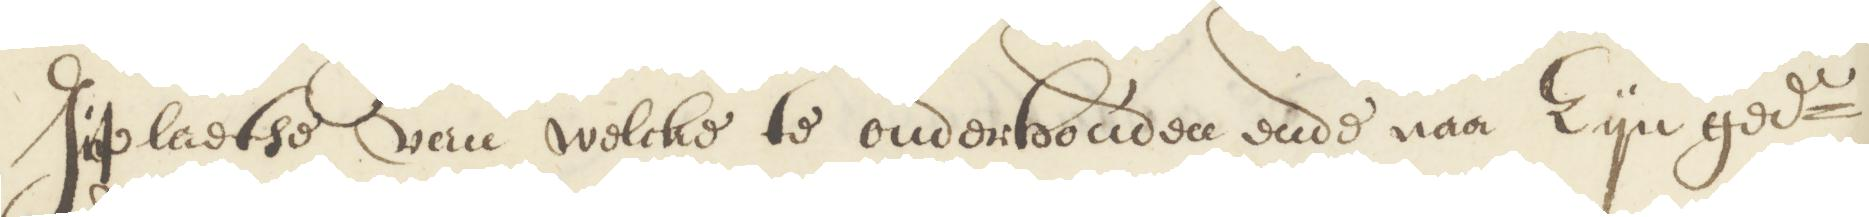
Jnplaetse van welcke te onderhouden ende naer zijn ged=e
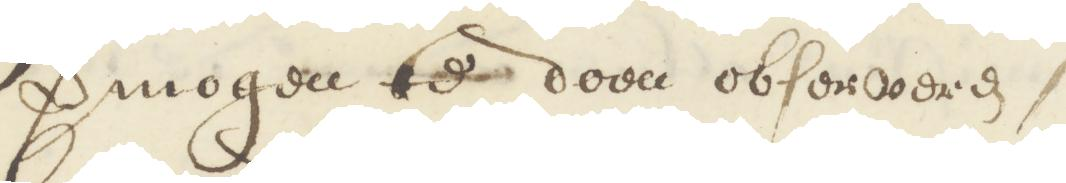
vermogen te doen observeren/
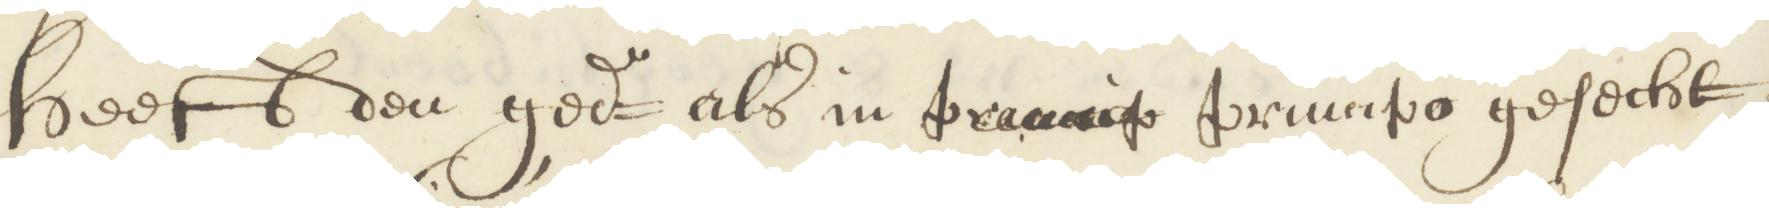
Heeft den ged=e als in princip principo gesecht
